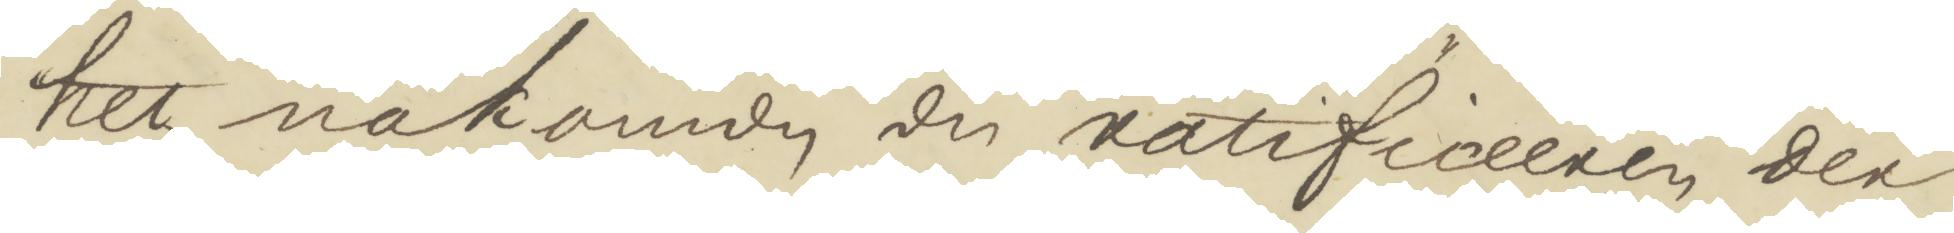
het nakomen en ratificeeren der
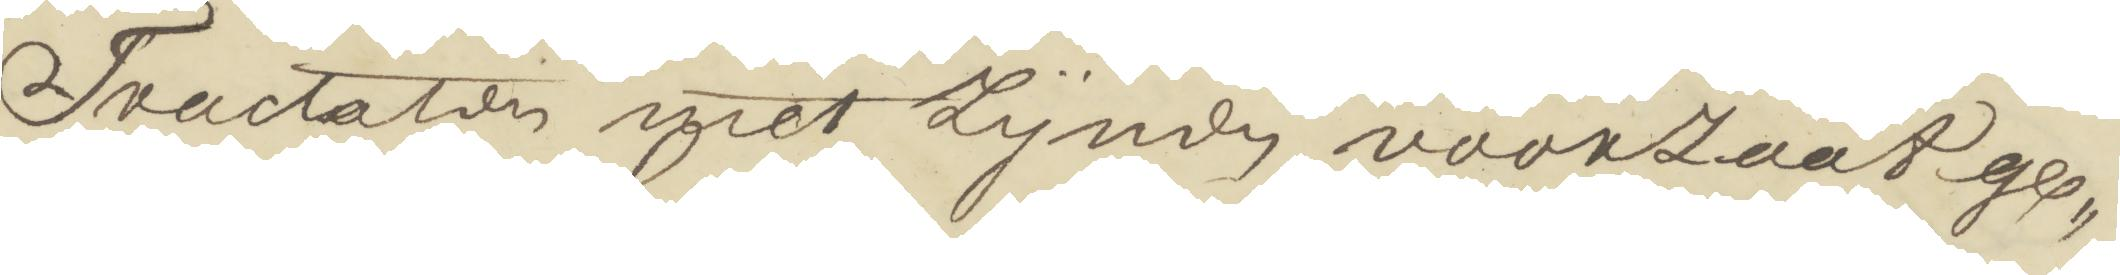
Tractaten met zijnen voorzaat ge„
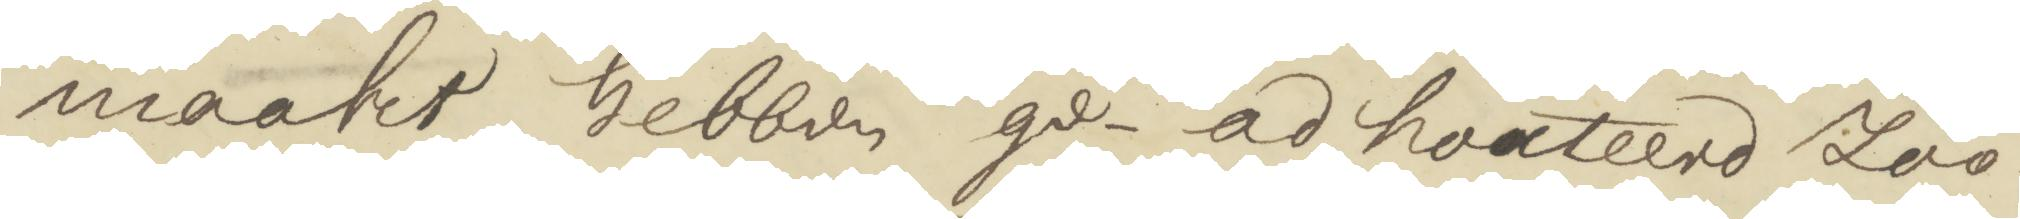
maakt hebben ge-adhorteerd zoo
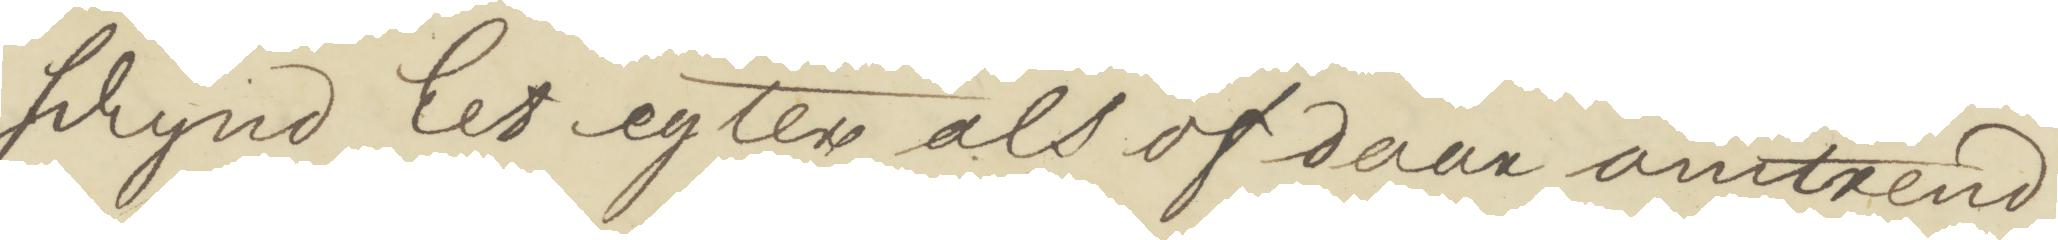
schijnd het egter als of daar omtrend
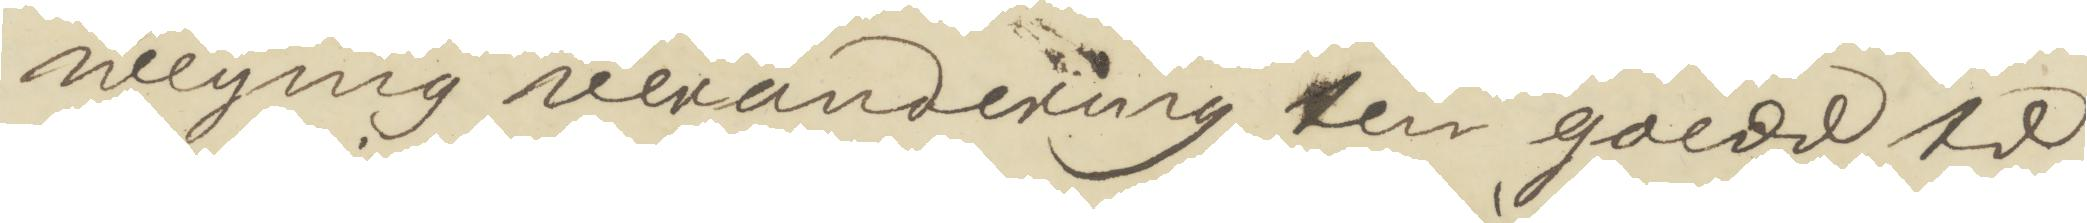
weijnig verandering ten goede te
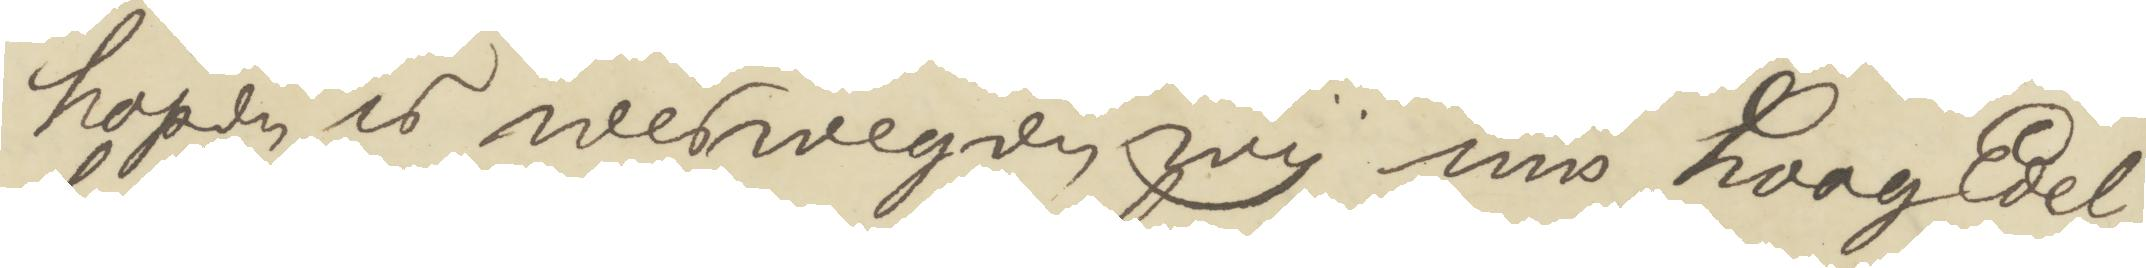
hopen is weswegen wij uw hoog Edel
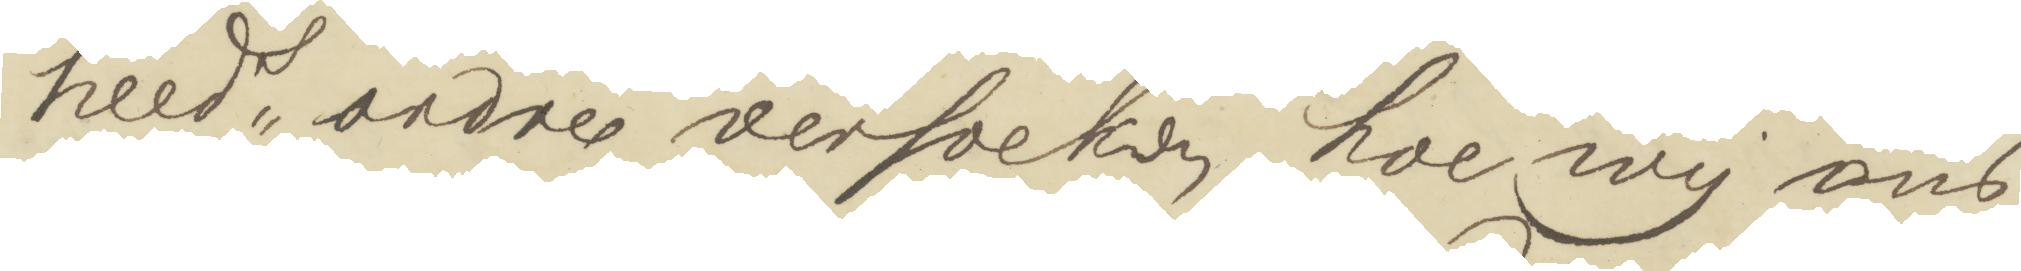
heed„s ordre versoeken hoe wij ons
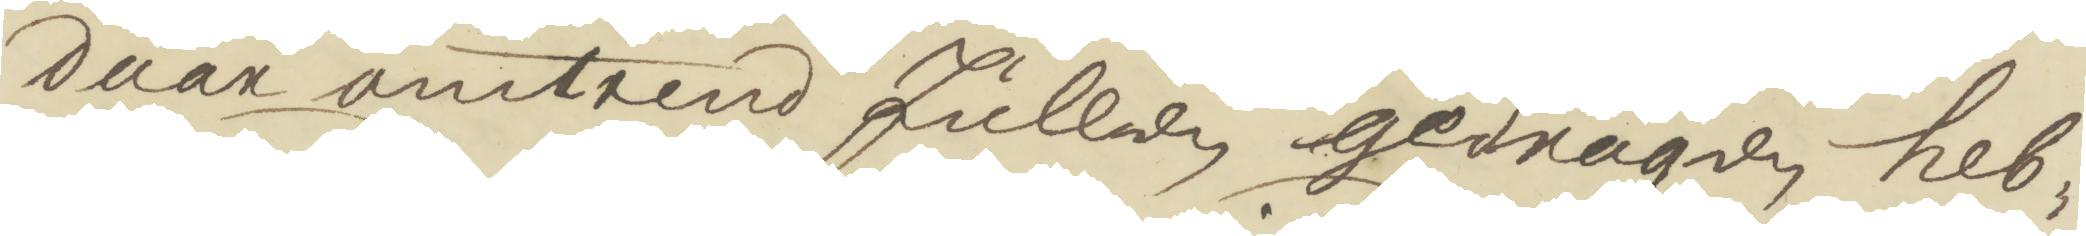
daar omtrend zullen gedragen heb„
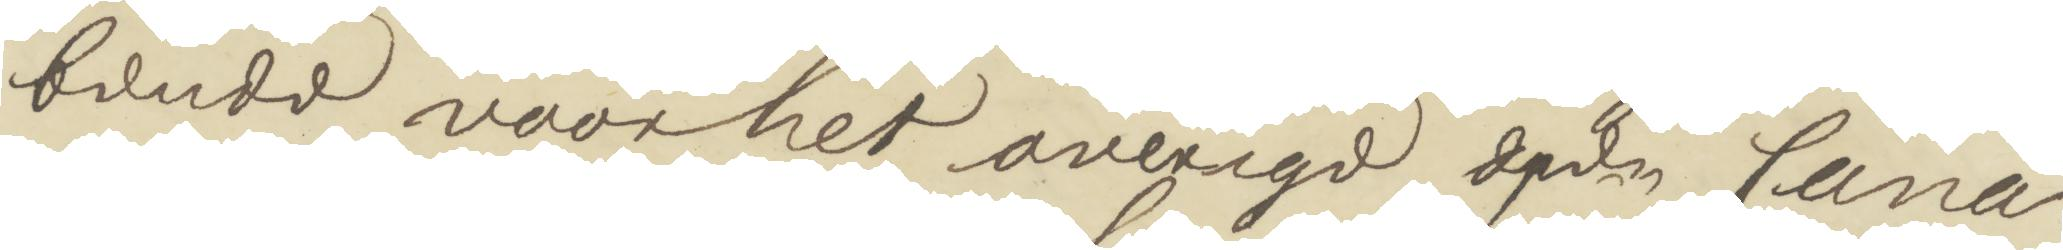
bende voor het overige desen Cana
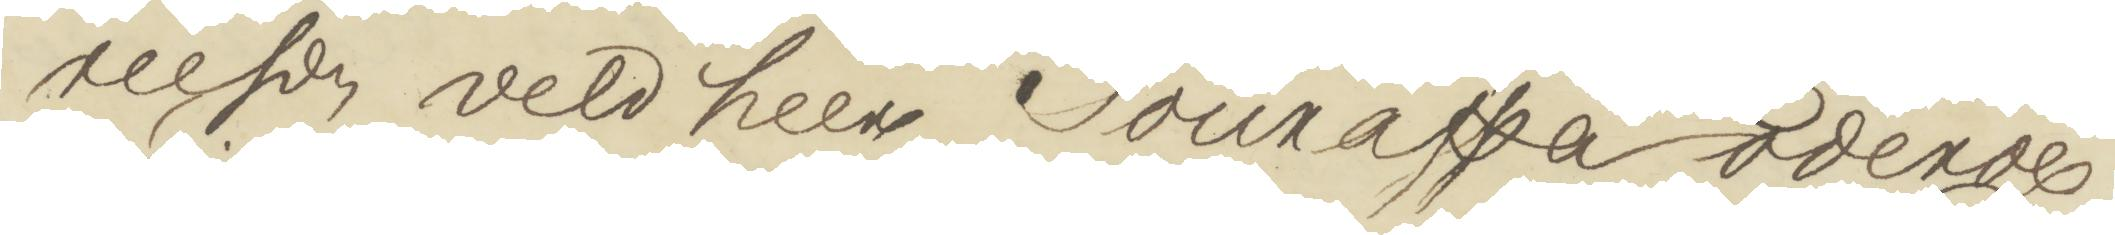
reesen veld heer sourappa oderde
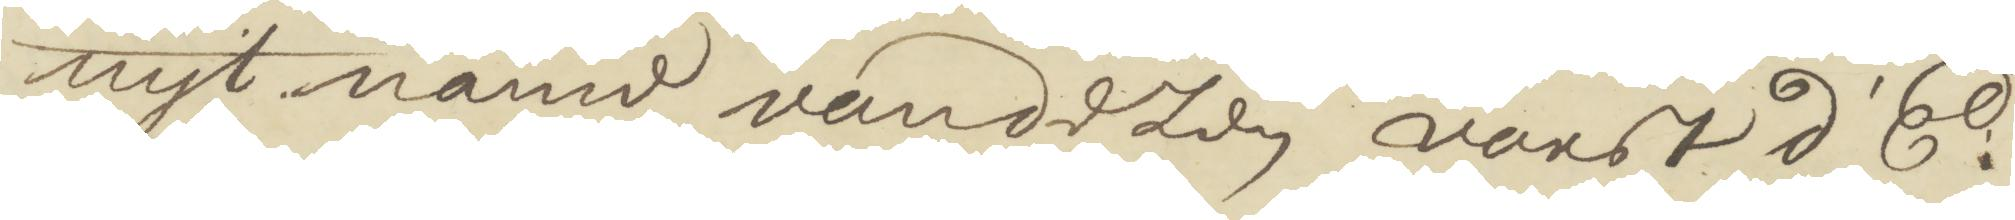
uijt name van dezen vorst d’E:
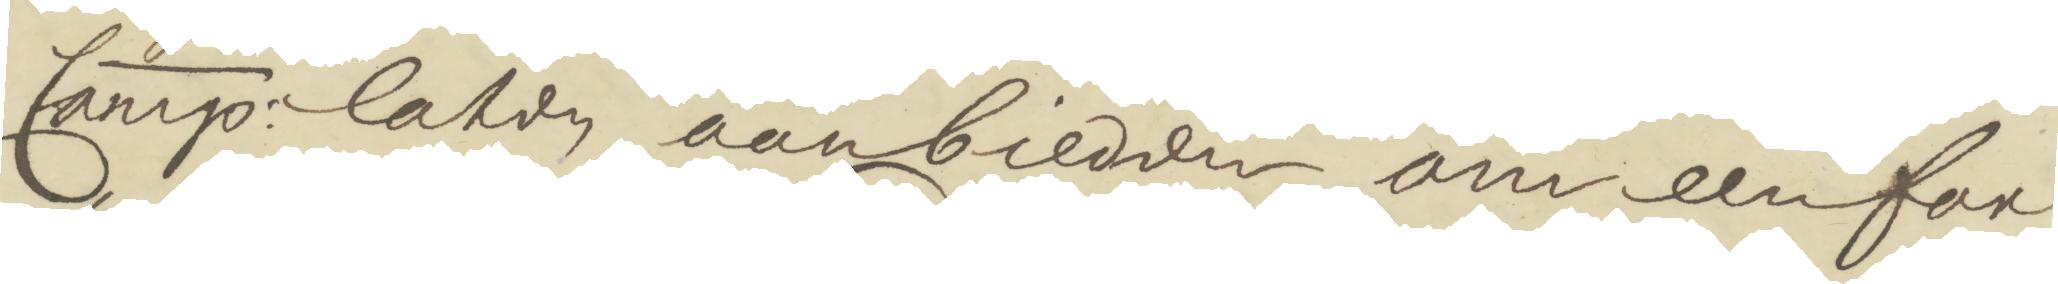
Comp: laten aanbieden om een for
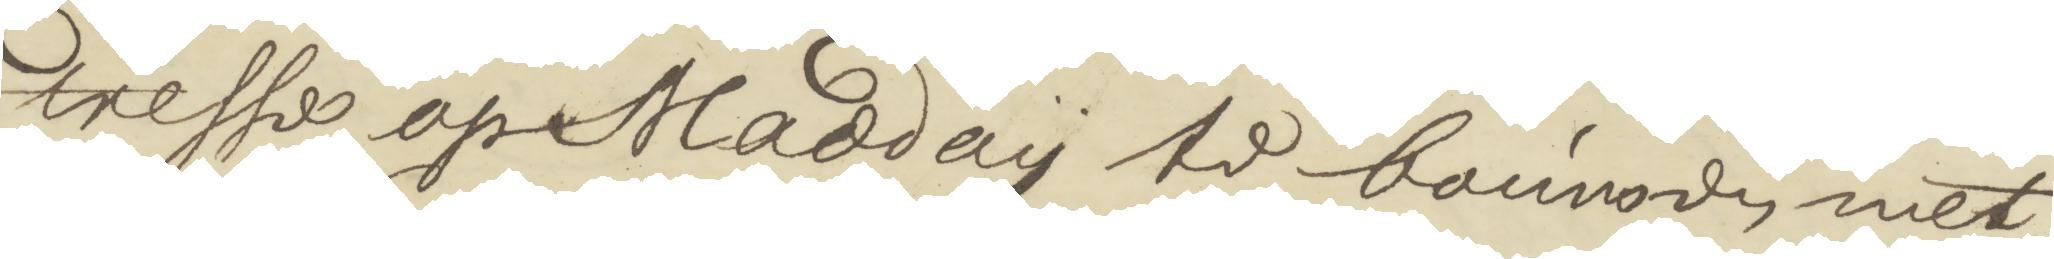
tresse op Maddaij te bouwen met
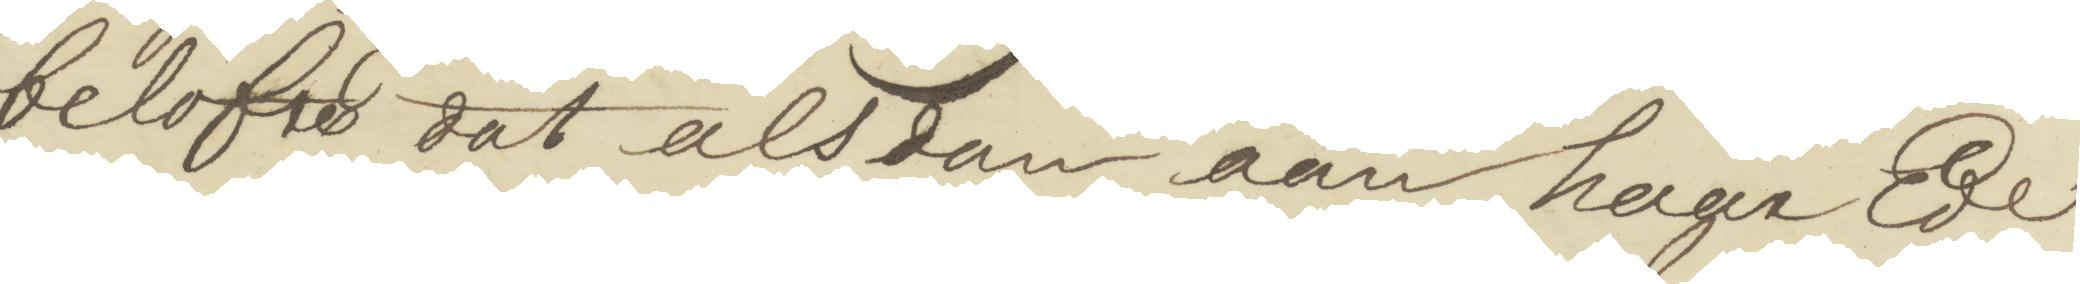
belofte dat als dan aan haar Ed„e
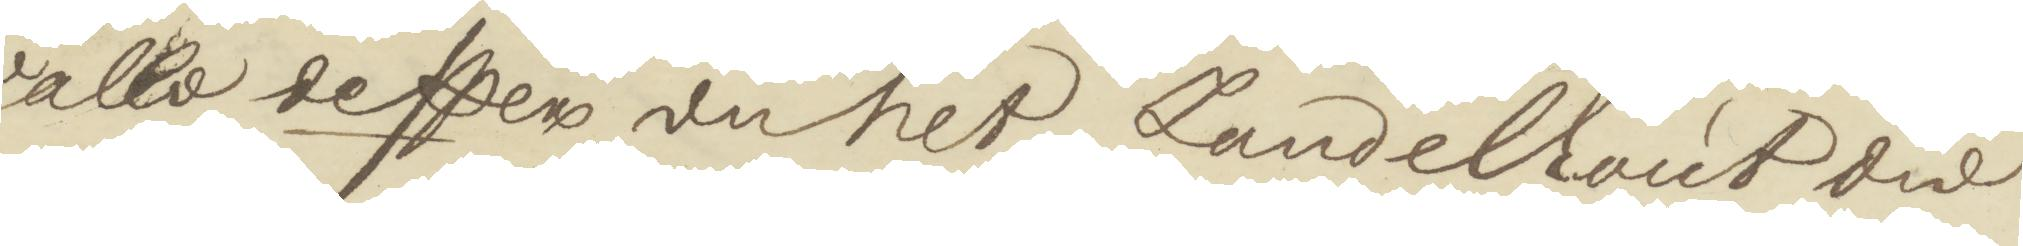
alle de pper en het zandelhout die
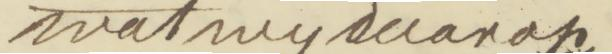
wat wij daarop
